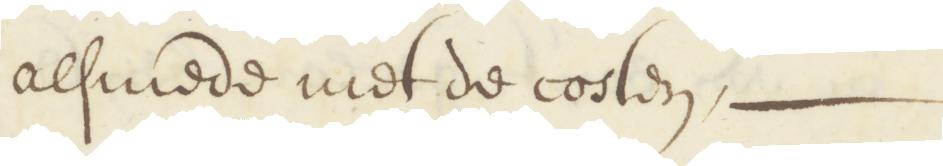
alsmede met de costen, —
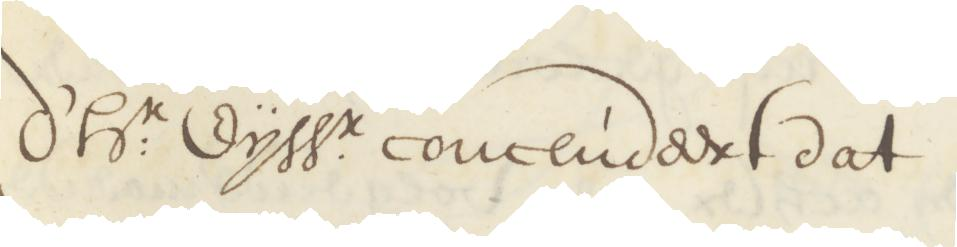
d’ H:r Eijss:r concludeert dat
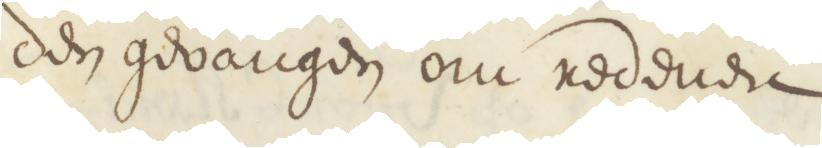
den gevangen om redenen
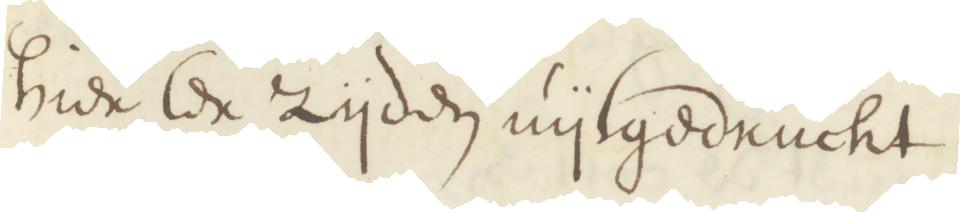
hier ter Zijden uijtgedruckt
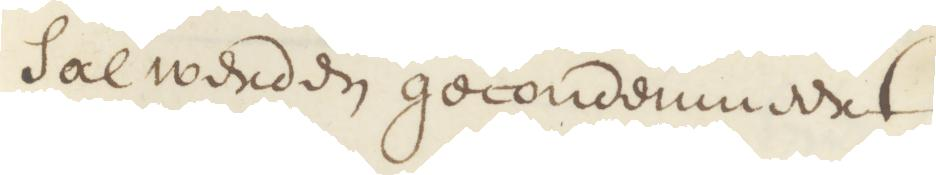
Sal werden gecondemneert
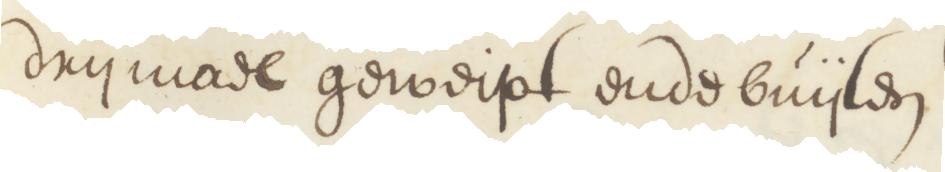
drij mael geweipt ende buijten
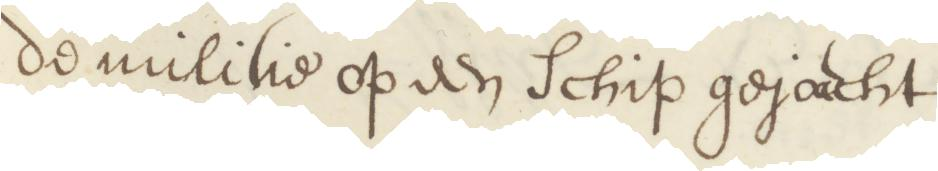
de militie op een schip gejaecht
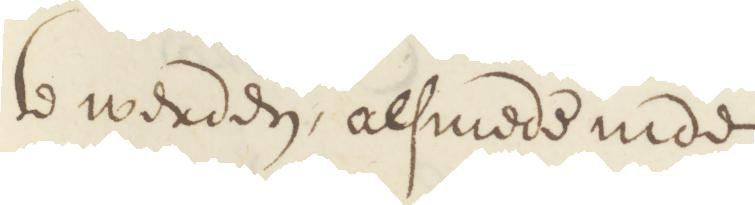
te werden, alsmede inde
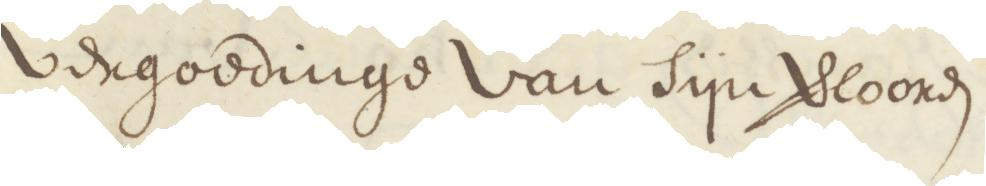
vergoedinge van sijn verlooren
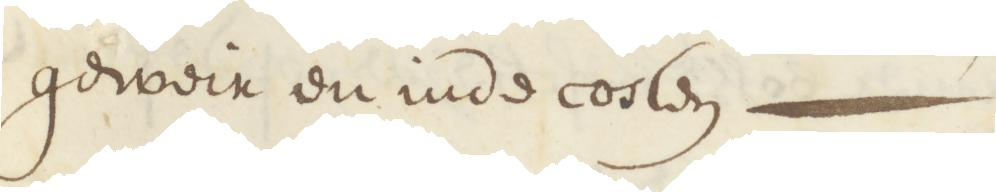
geweir en inde costen —
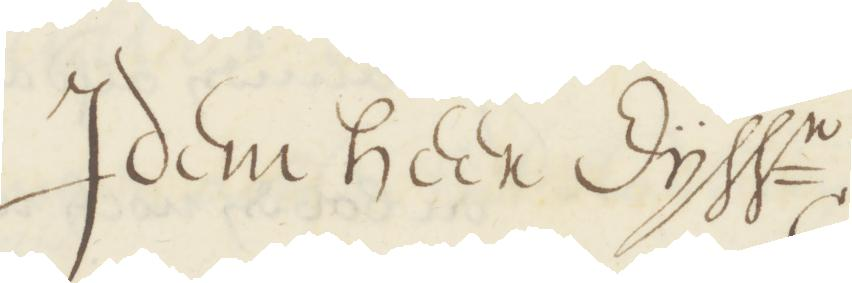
Idem heer Eijss=r
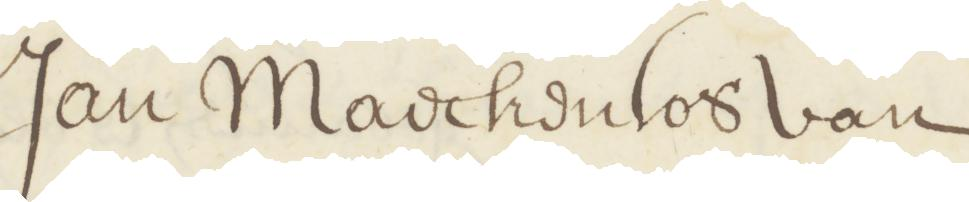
Jan Maeckentos van
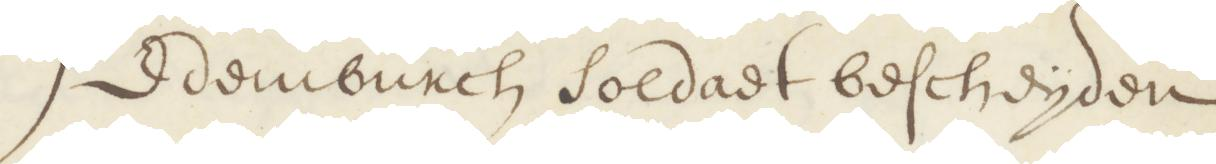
Edemburch soldaet bescheijden
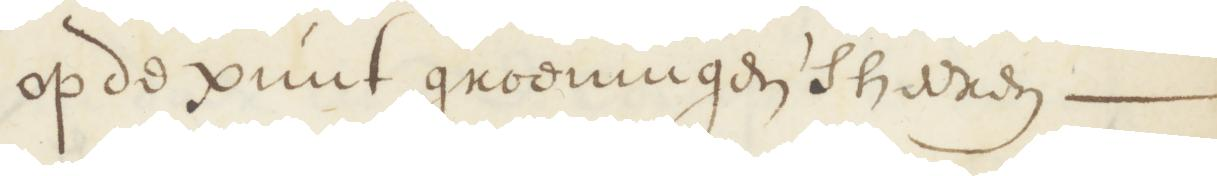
op de punt groeningen 's heeren —
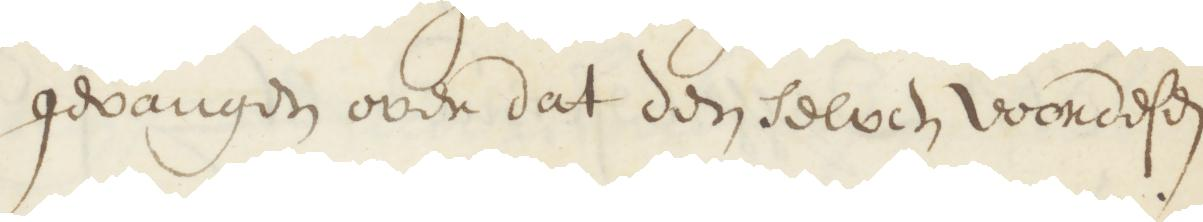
gevangen over dat den selven voordesen
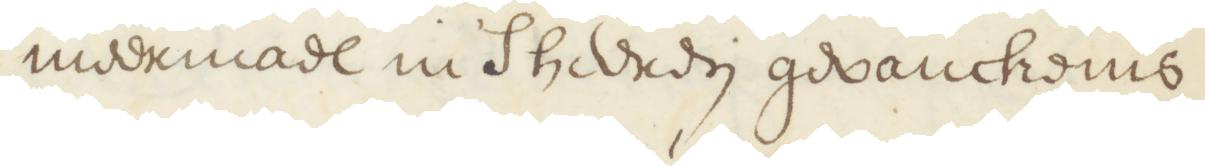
meermael in 's heeren gevanckenis
